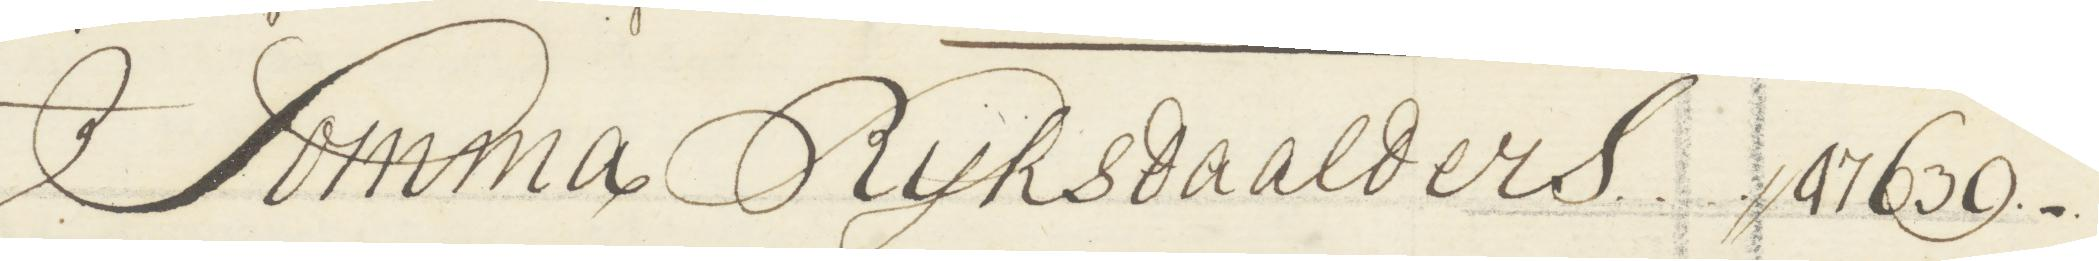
Somma Rijksdaalders. . . .„47639.-.
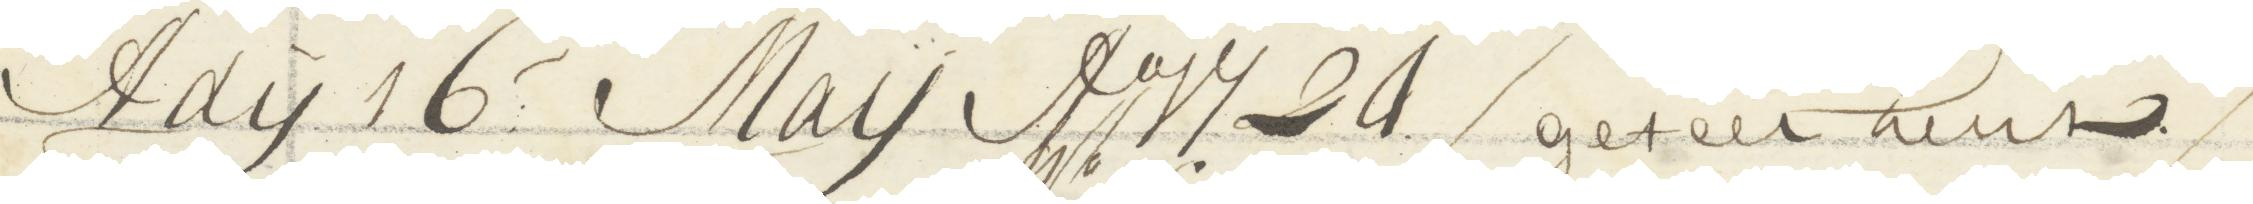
Adij 16:~ Maij A„o 1724. /geteeckent./
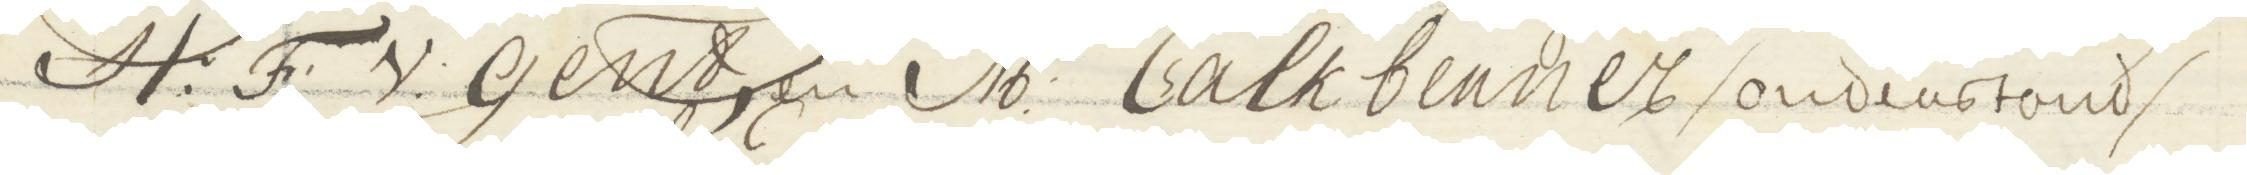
H: F: V: Gent, en M:r Calkberner /onderstond/
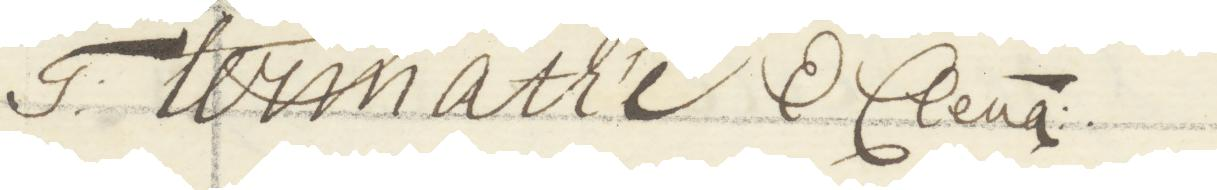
T: lermathe E Clerq:.
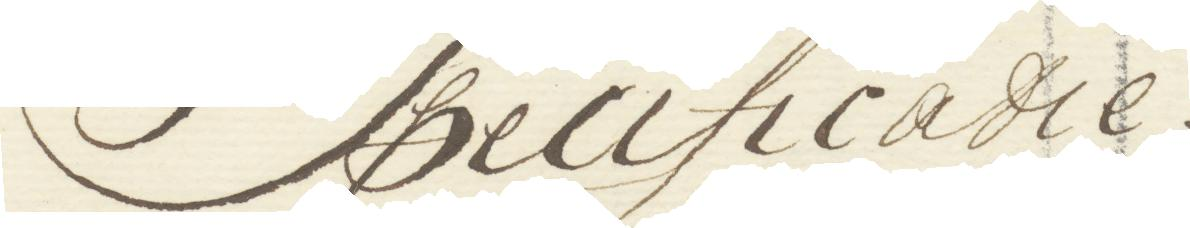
Specificatie.
